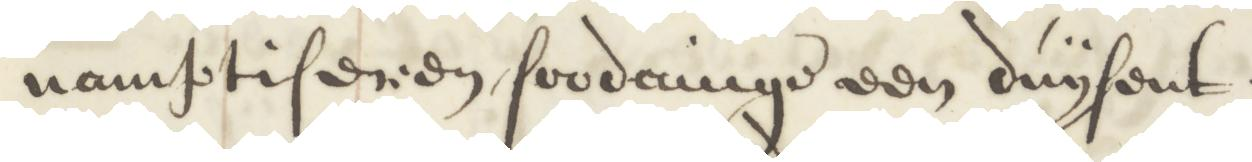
namptiseren soodanige een duijsent
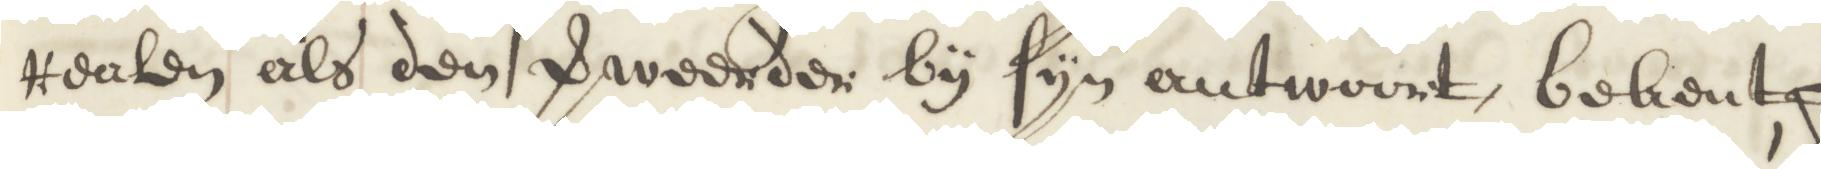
realen als den verweerder bij sijn antwoort, bekent
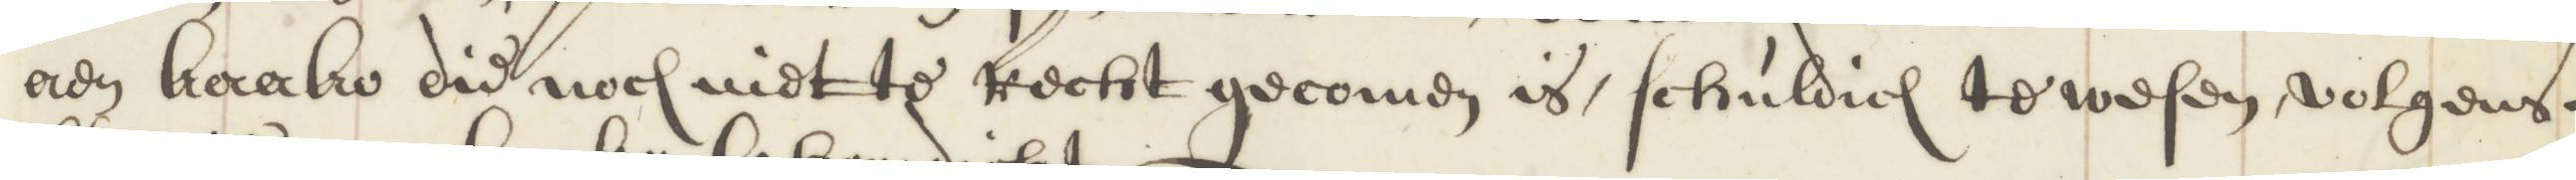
aen kaako die noch niet te recht gecomen is, schuldich te wesen volgens
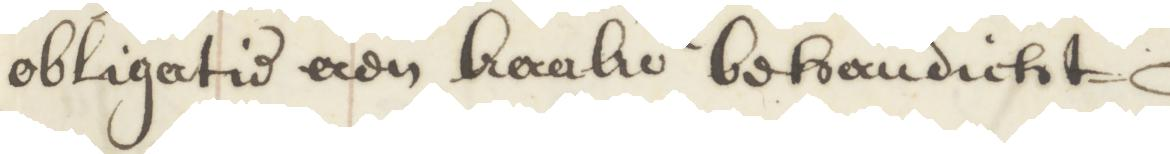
obligatie aen kaako behandicht
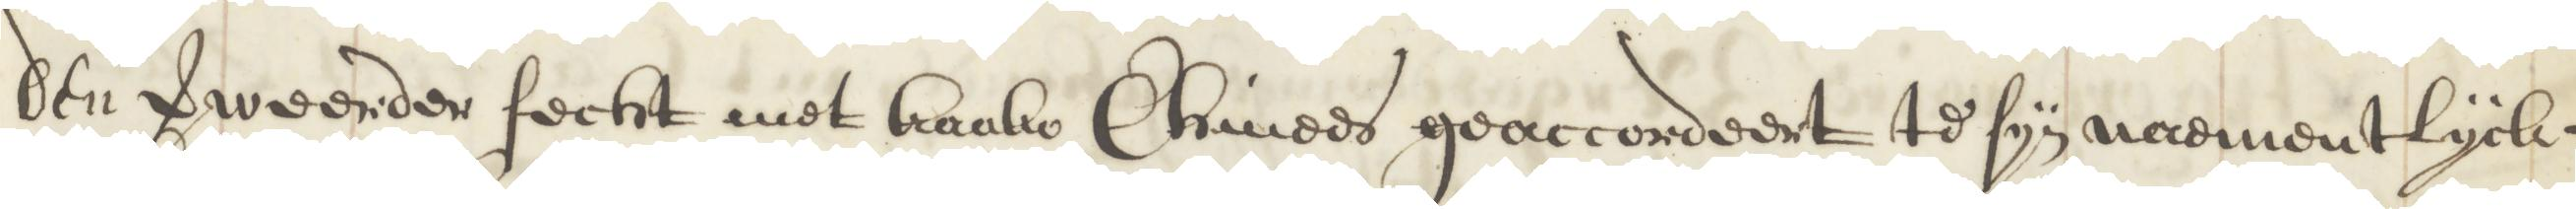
den verweerder secht met kaako Chinees geaccordeert te sijn naementlijck
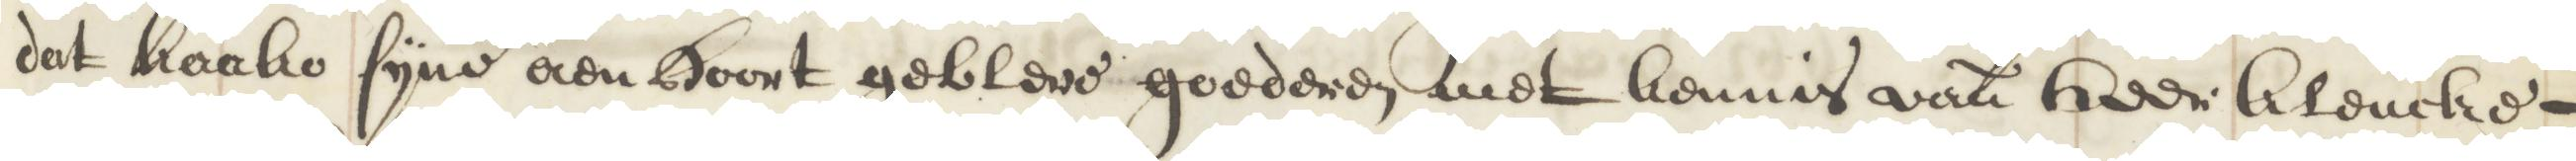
dat kaako sijne aen boort gebleve goederen met kennis van heer klencke
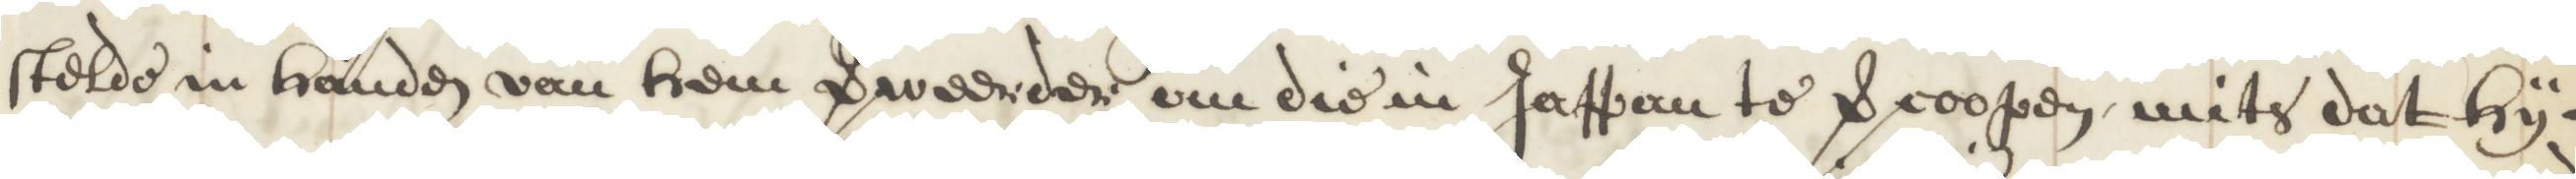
stelde in handen van hem verweerder om die in Jappan te vercoopen, mits dat hij
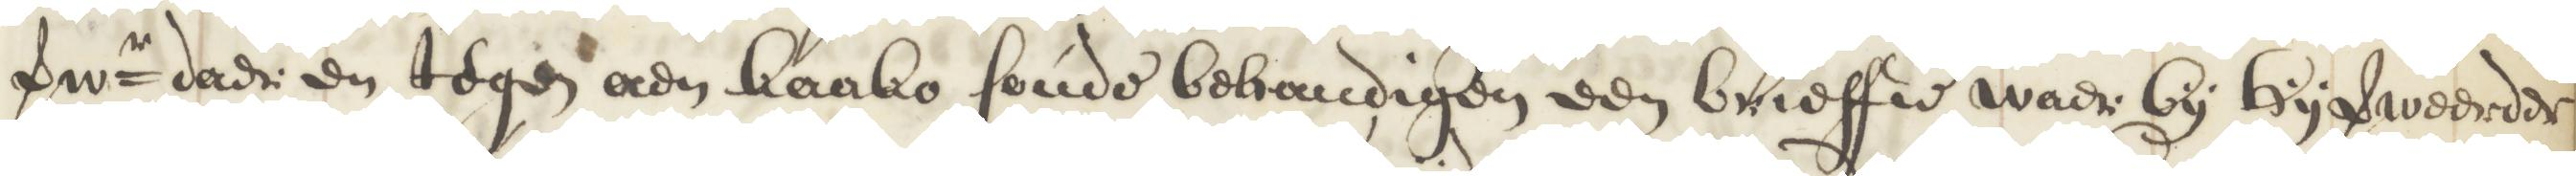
verw=r daer en tegen aen kaako soude behandigen een brieffie waer bij hij verweerder
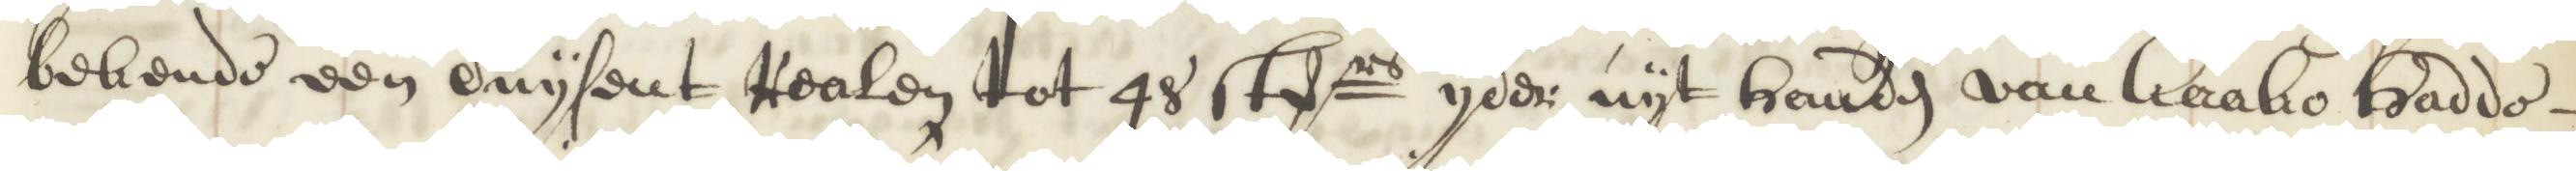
bekende een duijsent Realen tot 48 stver=rs ijder uijt handen van kaako hadde
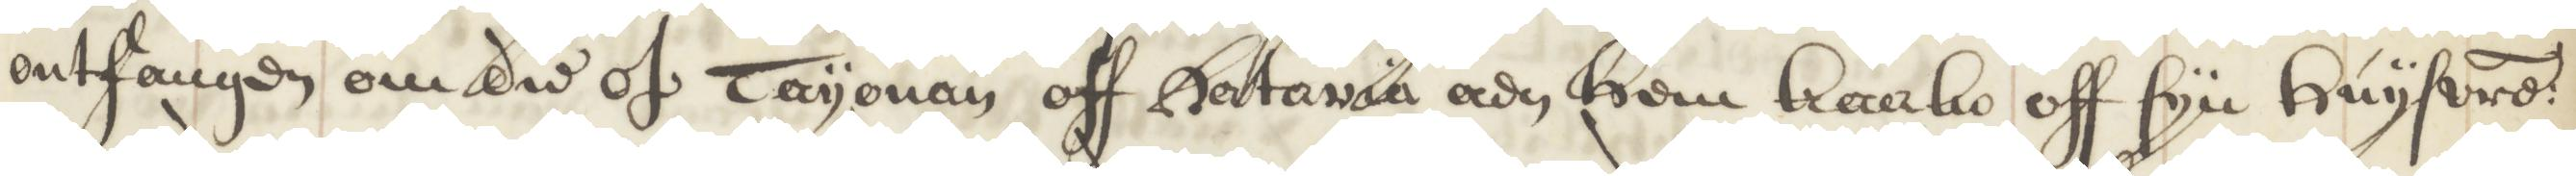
ontfangen om die op Taijouan off Batavia aen hem kaako off sijn huijsvre:e
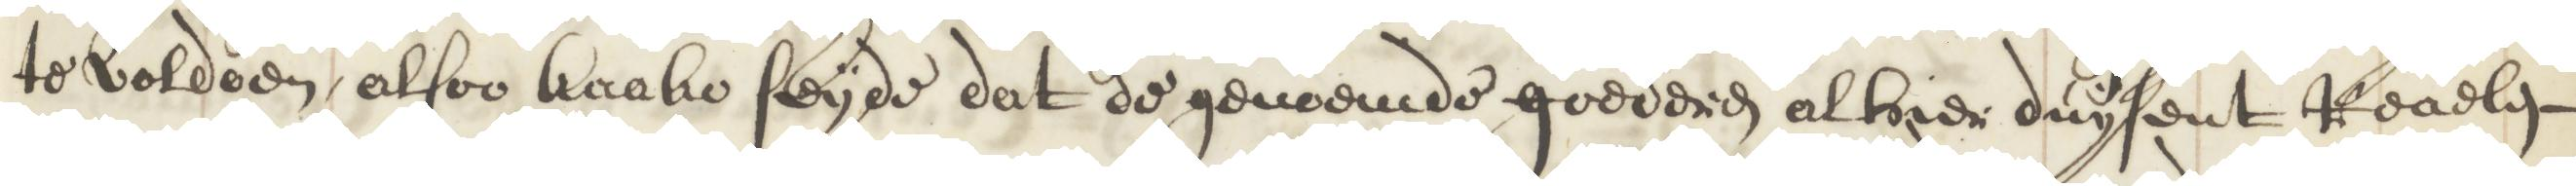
te voldoen, alsoo kaako seijde dat de genoemde goederen alhier duijsent Reaelen
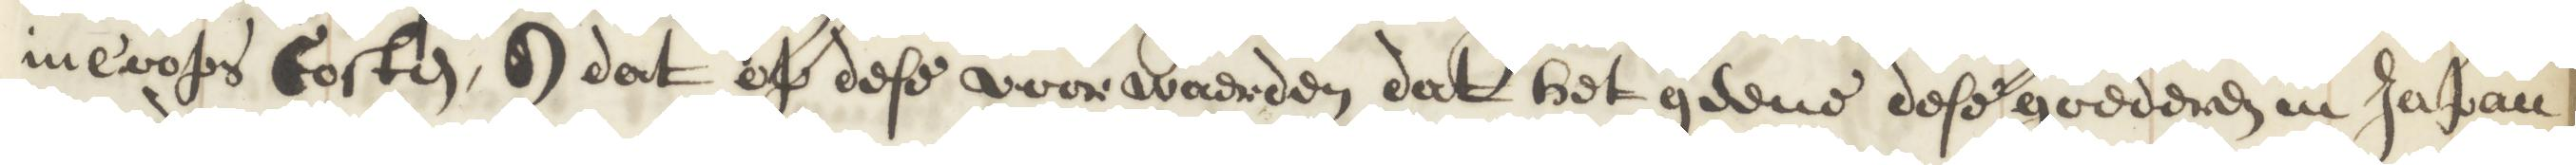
in coops costen, & dat op dese voorwaerden dat het geene dese goederen in Japan
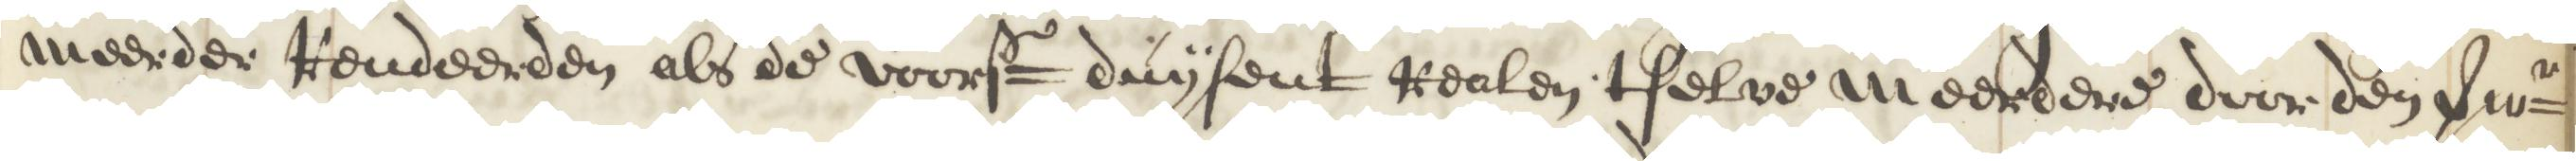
meerder Rendeerden als de voor=se duijsent Realen 'tselve meerdere door den verw=r
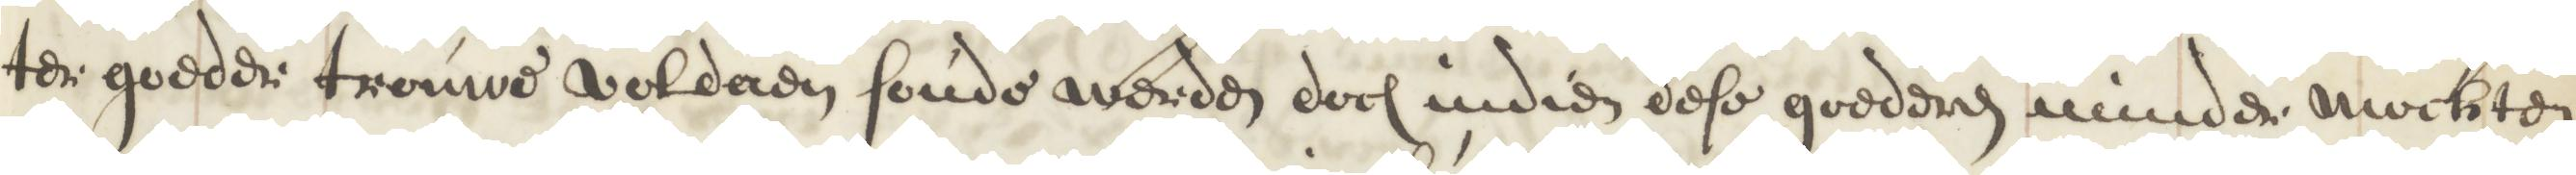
ter goeder trouwe voldaen soude werden doch indien dese goederen minder mochten
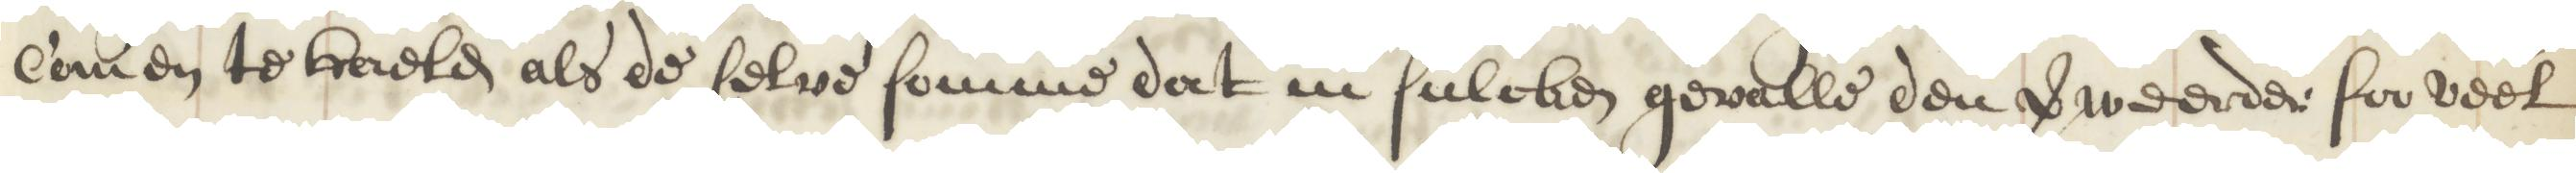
comen te haelen als de selve somme dat in sulcken gevalle den verweerder soo veel
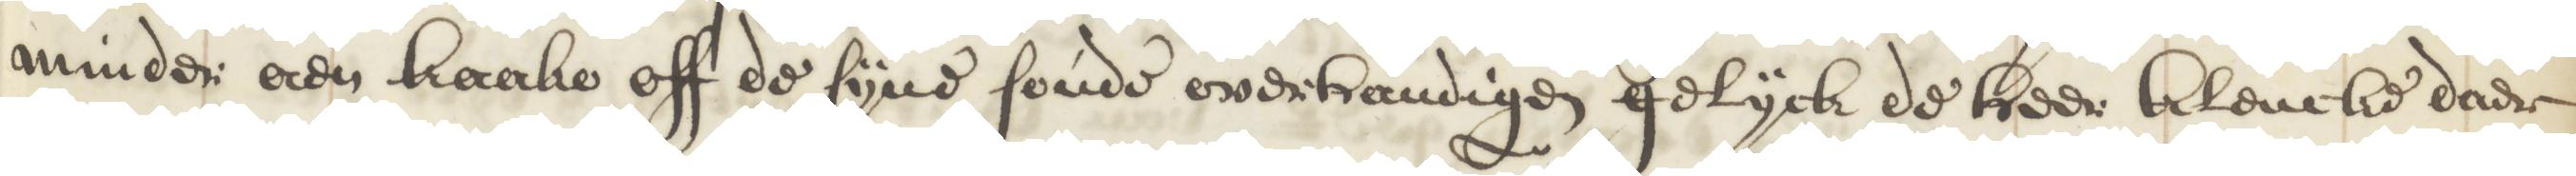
minder aen kaako off de sijne soude overhandigen gelijck de Heer klencke daer
